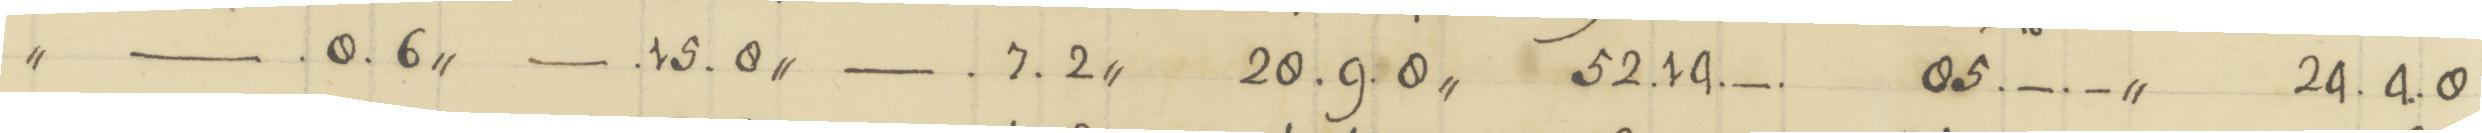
„ — .8.6„ — .15.8„ —.7.2„ 28.9.8„ 52.14.—. 85.—.—„ 24.4.8
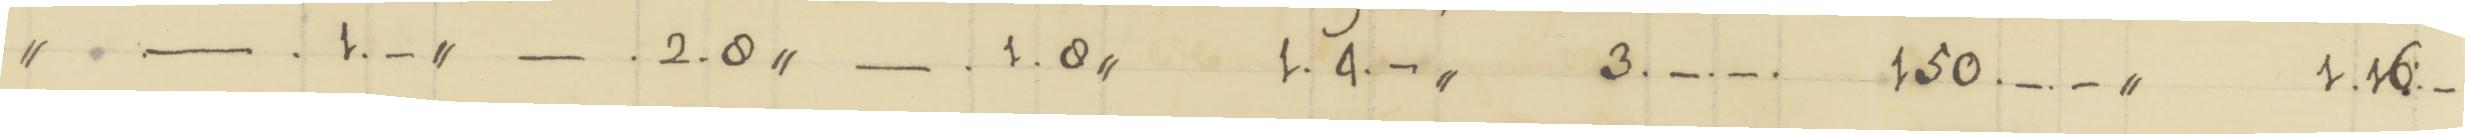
„ — .1.— „ — .2.8 „ — .1.8„ 1.4.—„ 3.—.—. 150.—.—„ 1:16:-
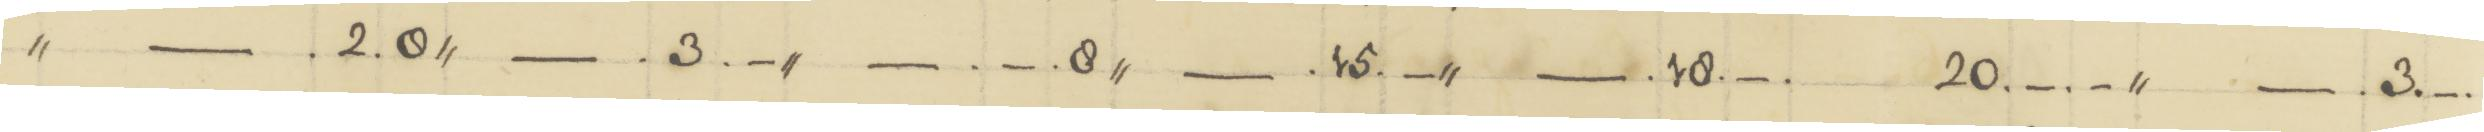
„ — .2.8„ — .3. —„ —. — 8„ —.15.—„ —.18.—. 20. —. —„ —.3.—.
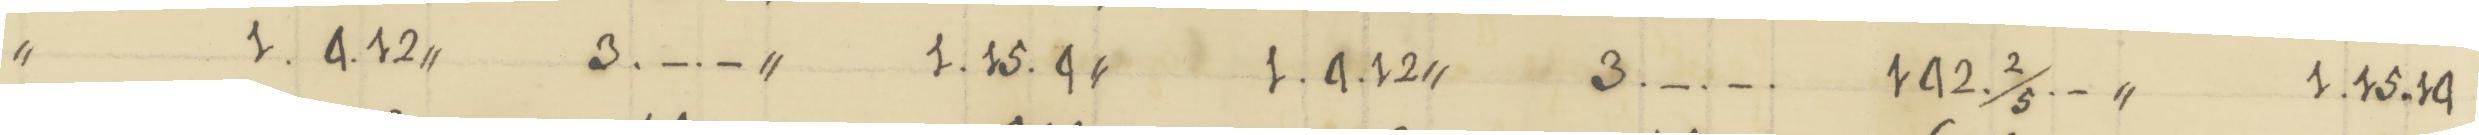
„ 1. 4.12„ 3.—.—„ 1.15.4„ 1.4.12„ 3.—.—. 142.2/5.—„ 1:15.14
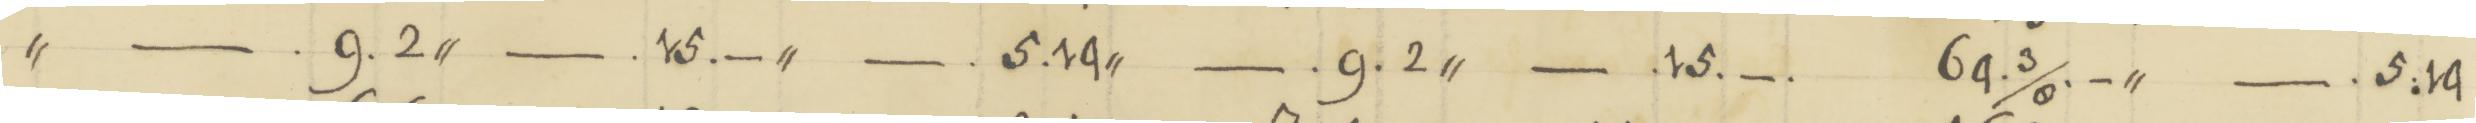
„ — . 9.2„ —.15.—„ —. 5.14„ —.9.2„ —.15.— 64.3/8.—„ —.5.14
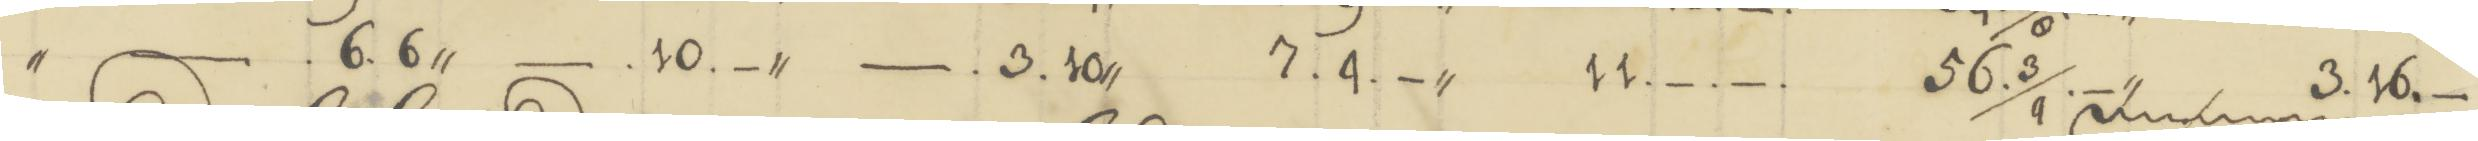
„ — . 6.6„ —.10.—„ —. 3.10„ 7.4.—„ 11.—.—. 56.¾.—„ 3.16.—
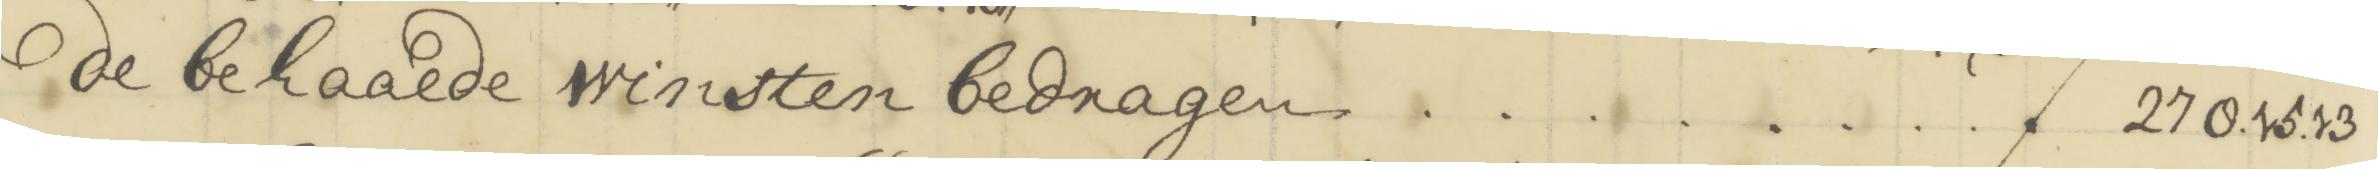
de behaalde winsten bedragen . . . . . . . . ƒ 278.15.13
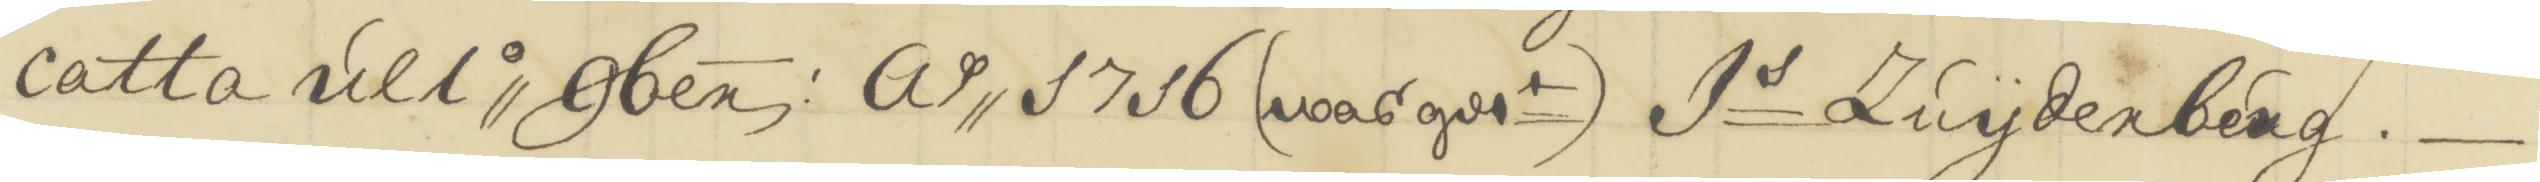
catta ult„o gber: Ao„ 1716 (was ges=t) J=s Zuijderberg .—
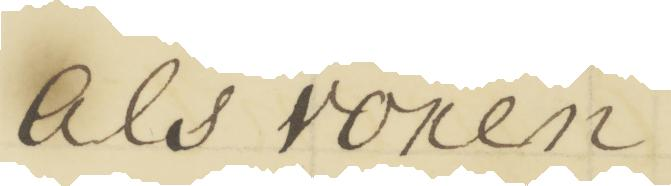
als voren
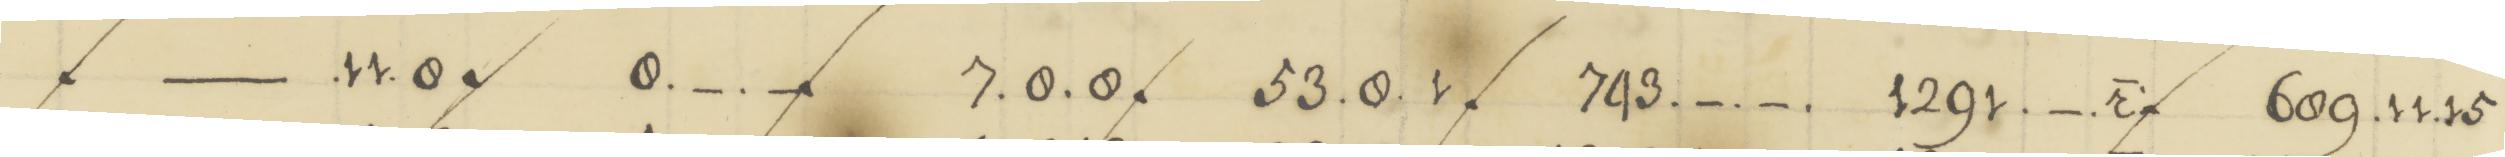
ƒ — .11.8ƒ 8.—.—ƒ 7.8.8ƒ 53.8.1ƒ 743:—.—. 1291.—.r'f 689.11.15
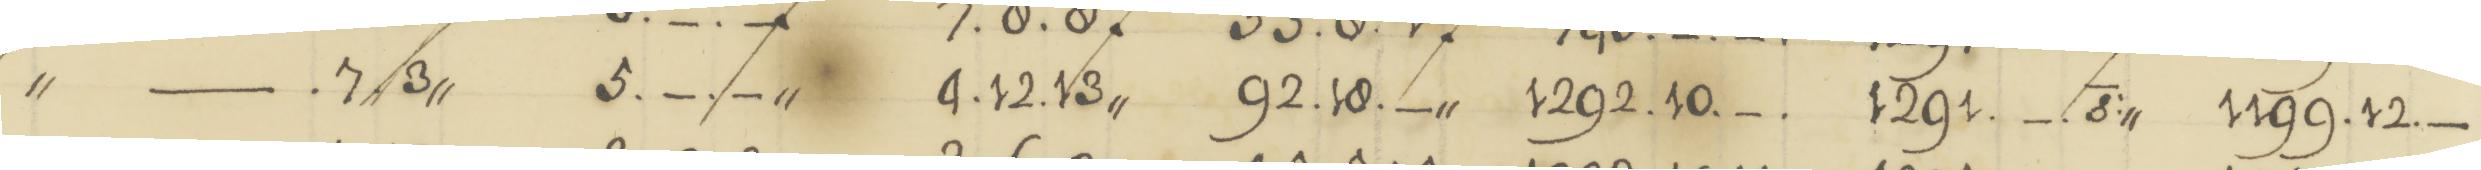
„ — .7.3„ 5.—.—„ 4.12.13„ 92.18.—„ 1292.10.—. 1291.—.s: 1199.12.—
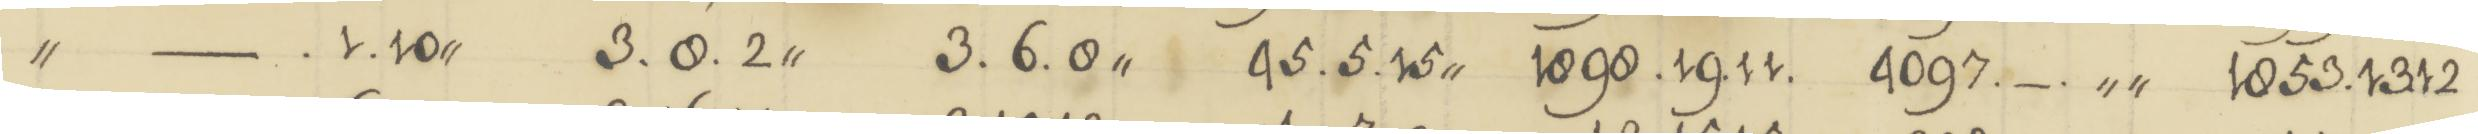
„ — .1.10„ 3.8.2„ 3.6.8„ 45.5.15„ 1898.19.11. 4097.—. „„ 1853.1312
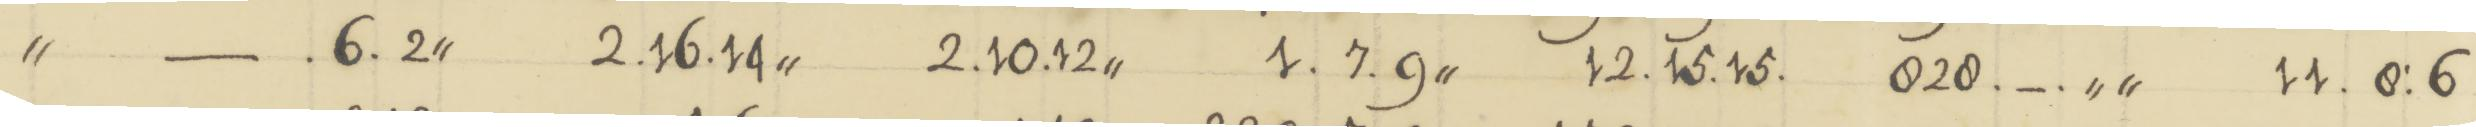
„ — .6. 2„ 2.16.14„ 2.10.12„ 1.7.9„ 12.15.15. 828.—. „ „ 11.8:6
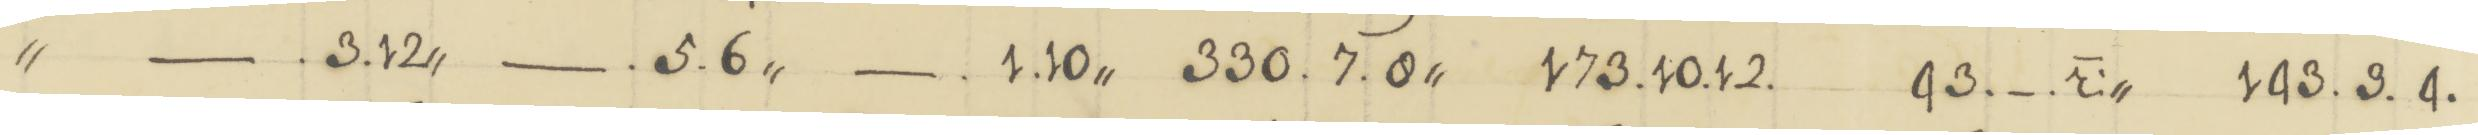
„ — .3.12„ 5.6 „ —. 1.10„ 330:7:8„ 173.10.12. 43.—.r:„ 143.3.4.
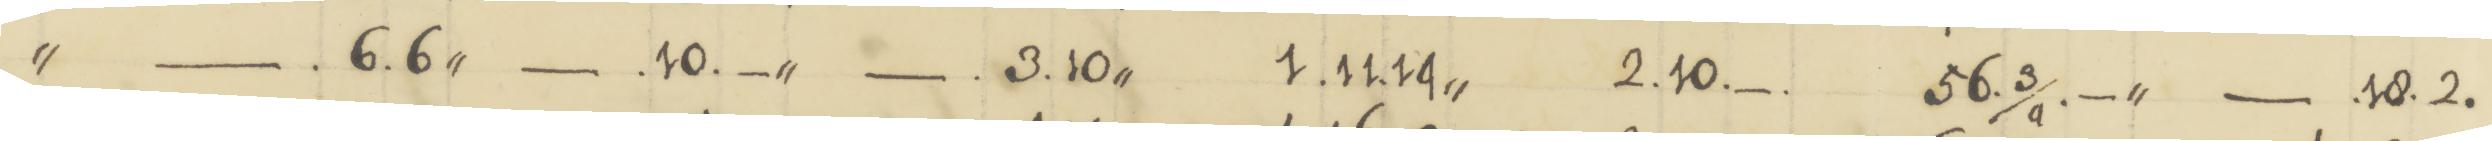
„ — .6.6„ —.10.—„ —. 3.10„ 1.11.14„ 2.10.—. 56.3/4.—„ — .18.2.
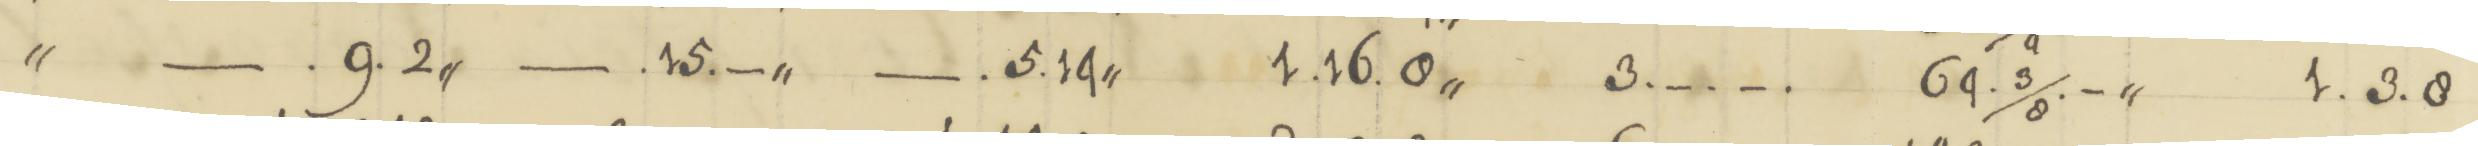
„ —.9.2„ —.15.—„ —.5.14„ 1.16.8„ 3.—.—. 64.3/8.—„ 1.3.8
